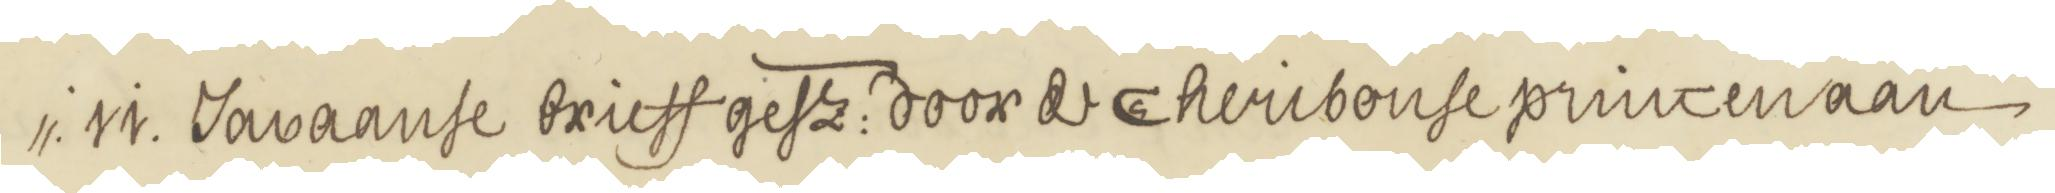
„. 11. Iavaanse brieff gesz: door de Cheribonse princen aan
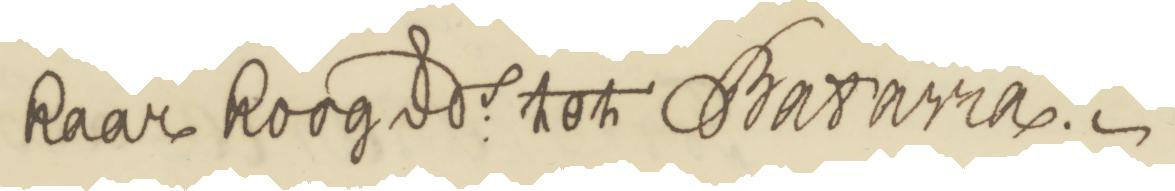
haar hoog Ed:s tot Batavia. —
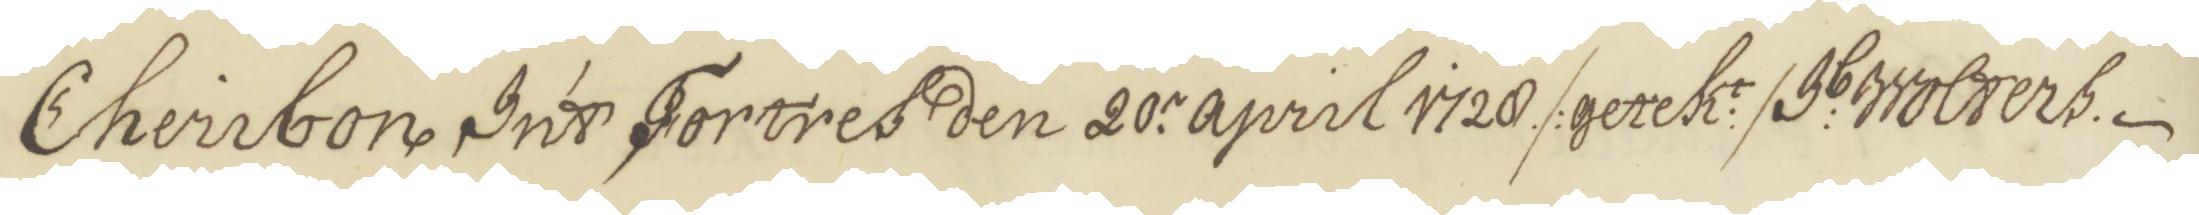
Cheribon In't Fortres den 20:e april 1728. /:getek:t / I:b wolters. —
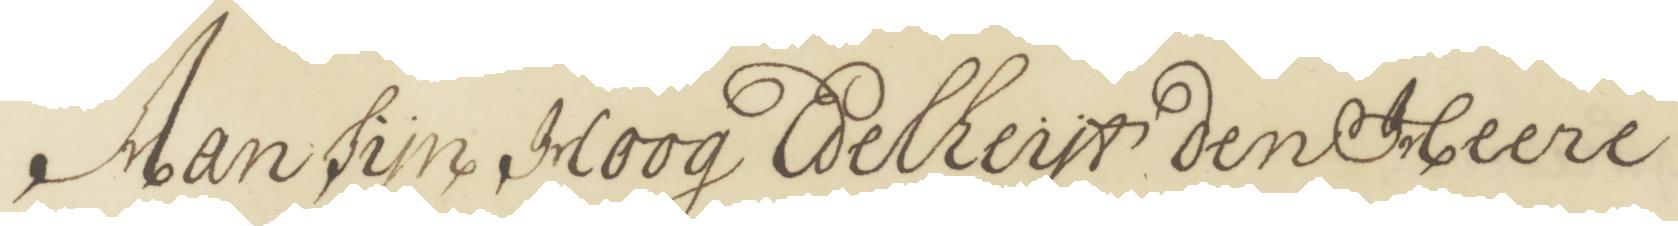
Aan sijn Hoog Edelheijt den Heere
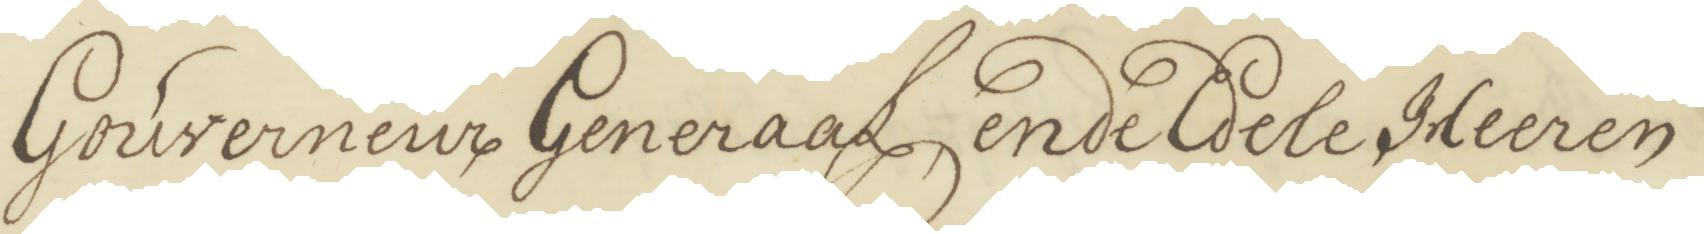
Gouverneur Generaal, ende Edele Heeren
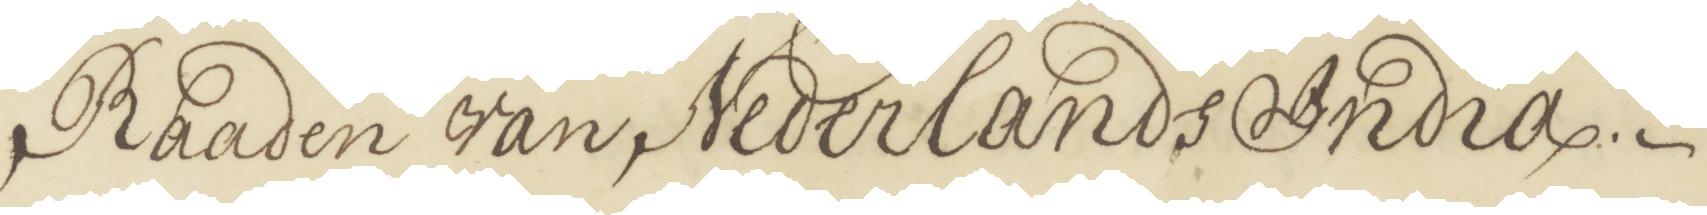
Raaden van Nederlands India. —
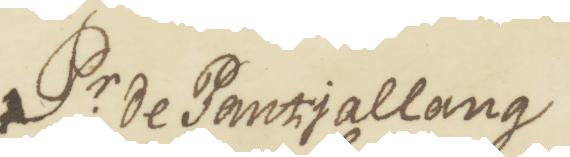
P:r de Pantjallang
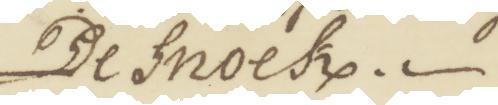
De Snoek. —
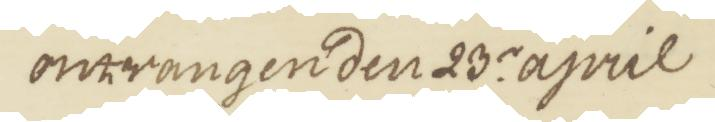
ontvangen den 23:e april
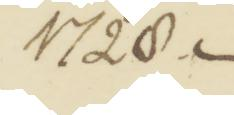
1728. —
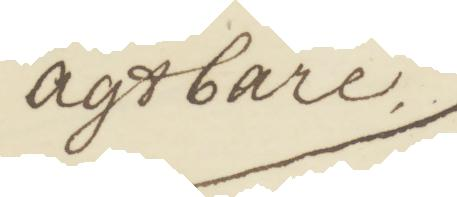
agtbare,
